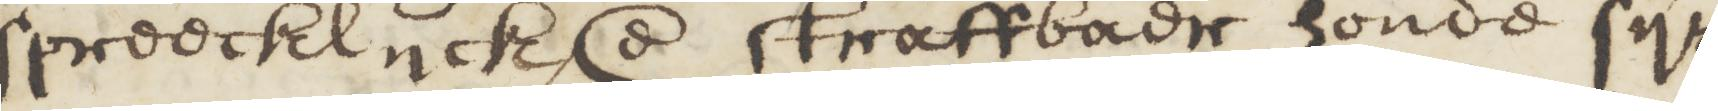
spreecklijck ende straffbaer soude sijn
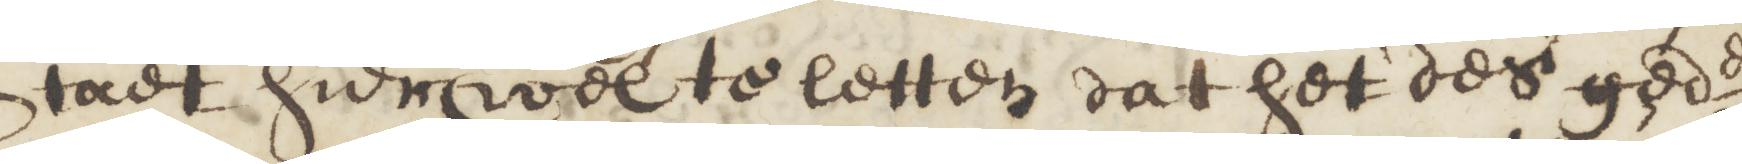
Staet hierwel te letten dat het des ged=
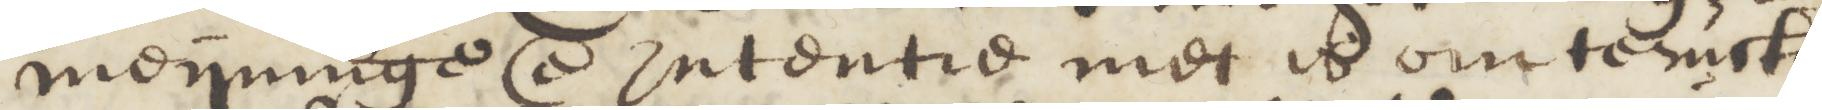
meijninge ende Jntentie niet is om te susti
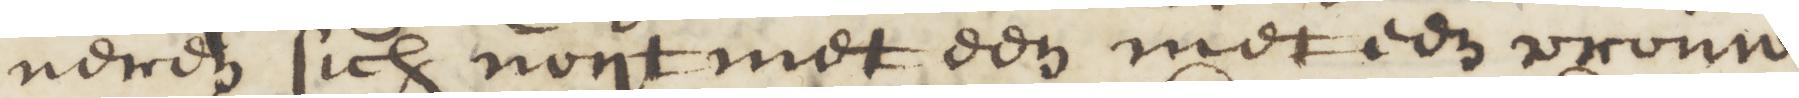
neren sich noijt met een met een vrouw
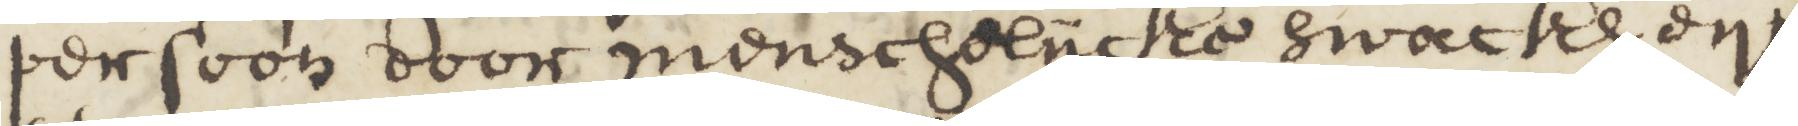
persoon door menschelijcke swackheijt
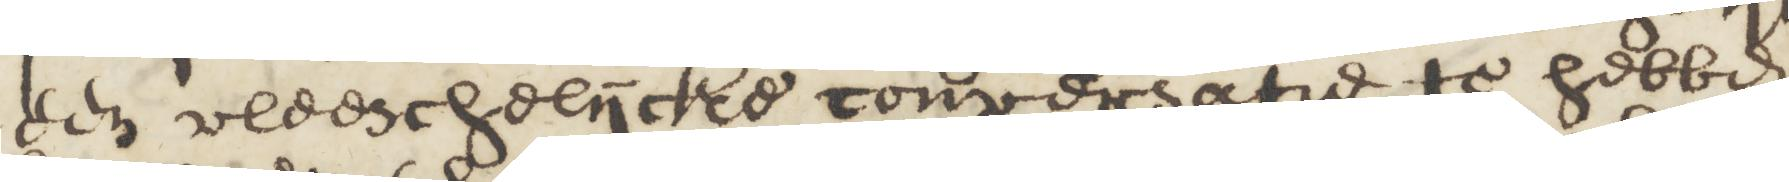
een vleeschelijcke conversatie te hebben
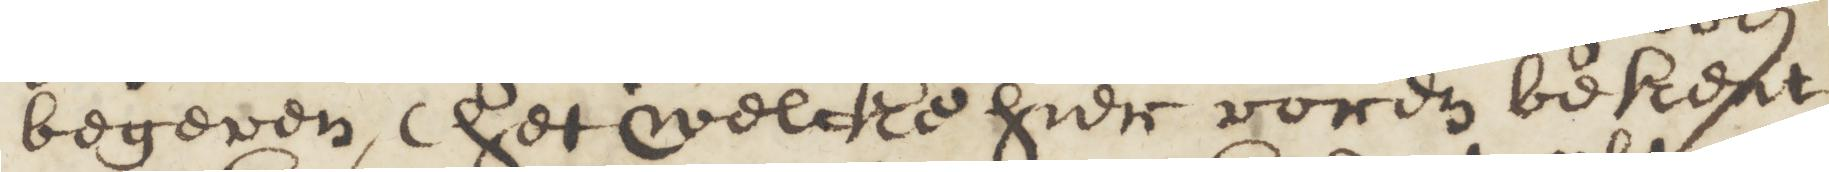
begeven ( het welcke hier voren bekent
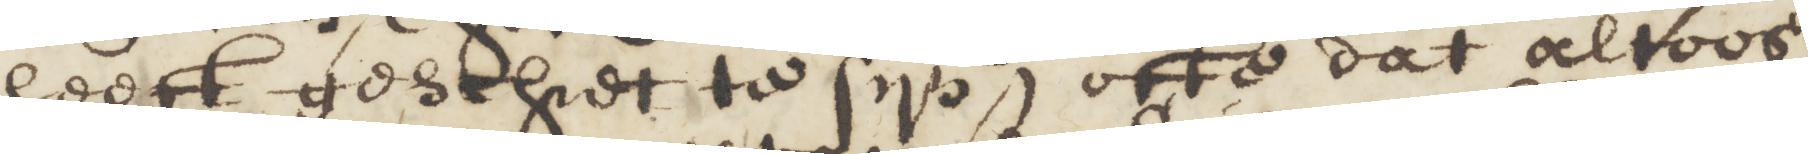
eest geschiet te sijn) offe dat alvoor
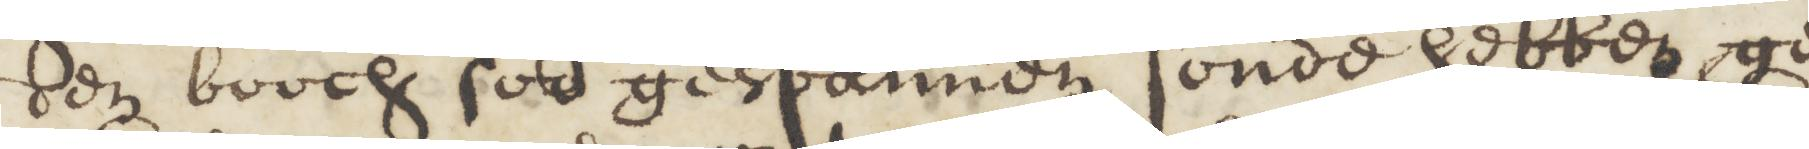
Een booch soo gespannen soude hebben ge
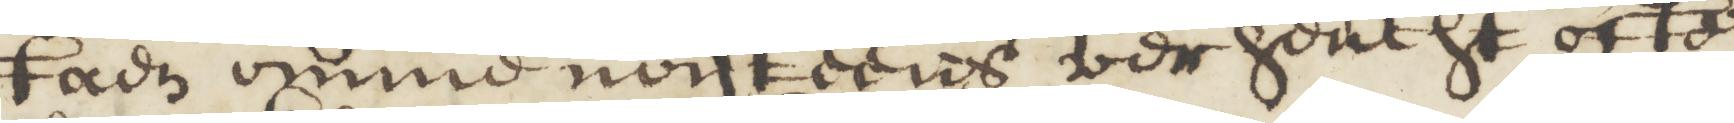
staen omme noijteens verhercht ofte
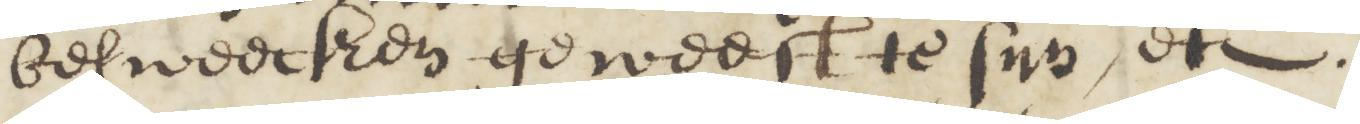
besweecken geweest te sijn, etc.
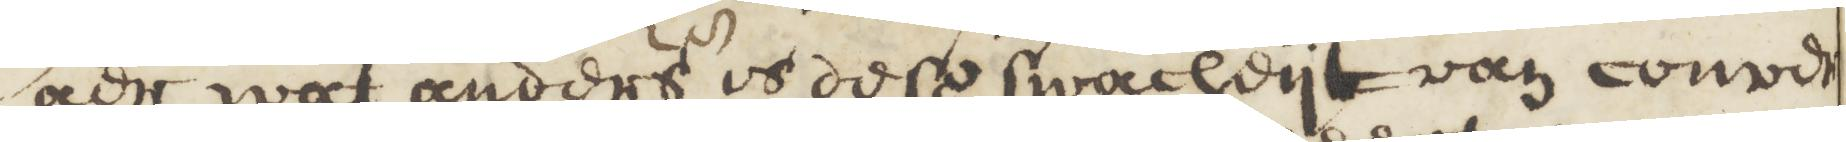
Maer wat anders is dese swacheijt van conver
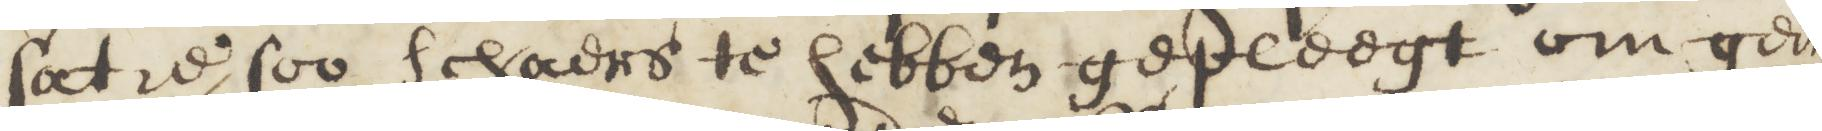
satie soo schaers te hebben gepleegt om gee
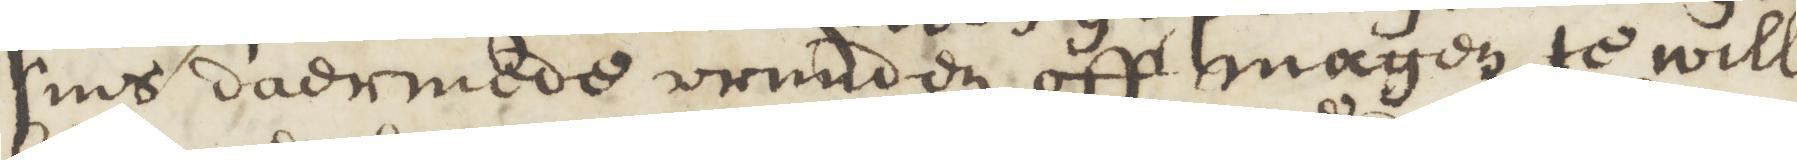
sins daermede vrunden off magen te will
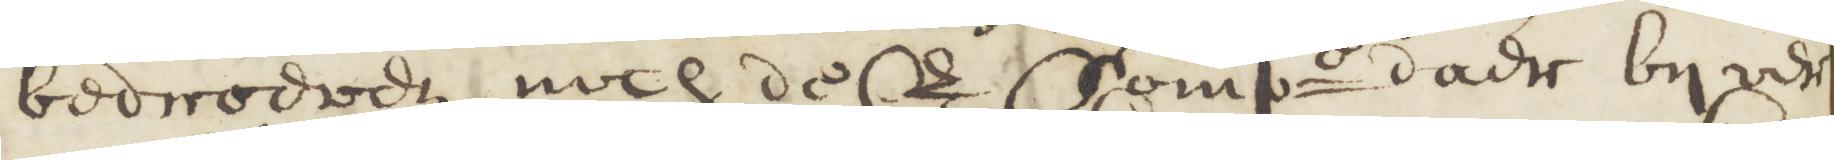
bedroeven, noch de E: Comp=e daer bij ver
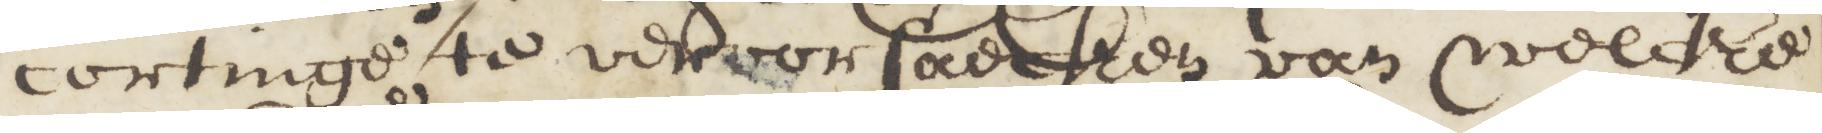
cortinge te veroorsaecken van welcke
